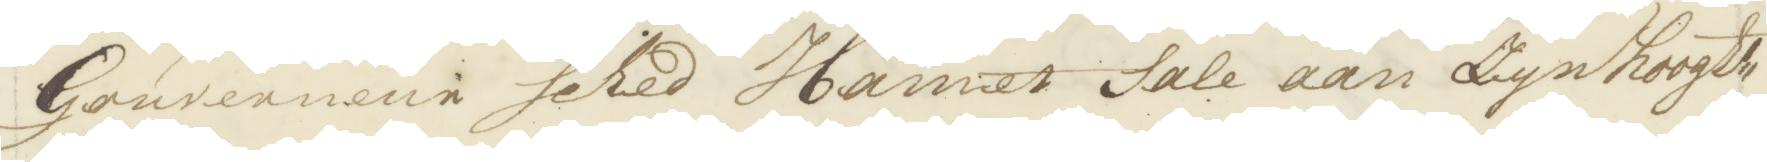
Gouverneur sched Hamet sale aan zijn hoogh
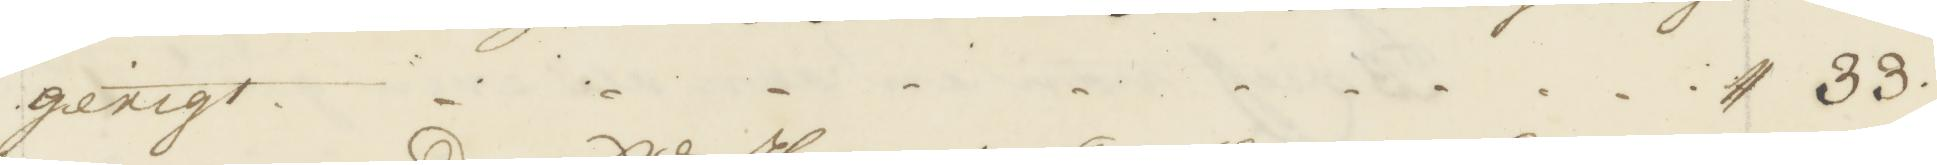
gerigt - - - - - - - - - - - „ 33.
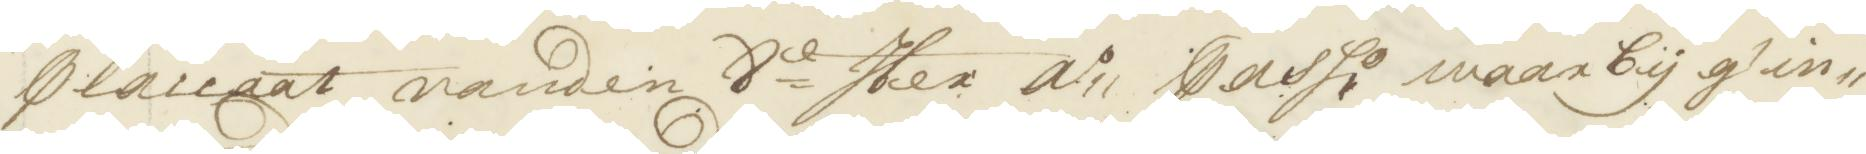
Placcaat vanden 8=e Jber a„o pass„o waar bij g’ in„
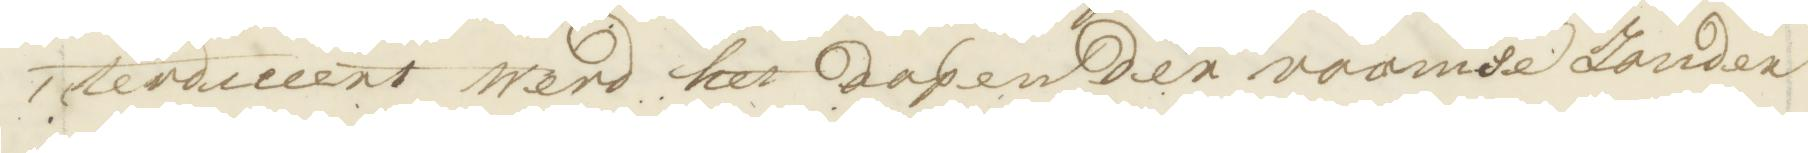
terdiceert werd het dopen der roomse zonder
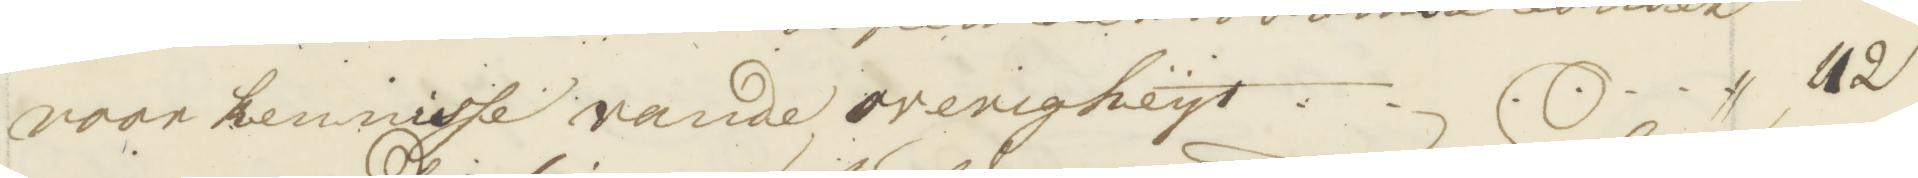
voor kennisse vande overigheijt - - - - - - „ 42
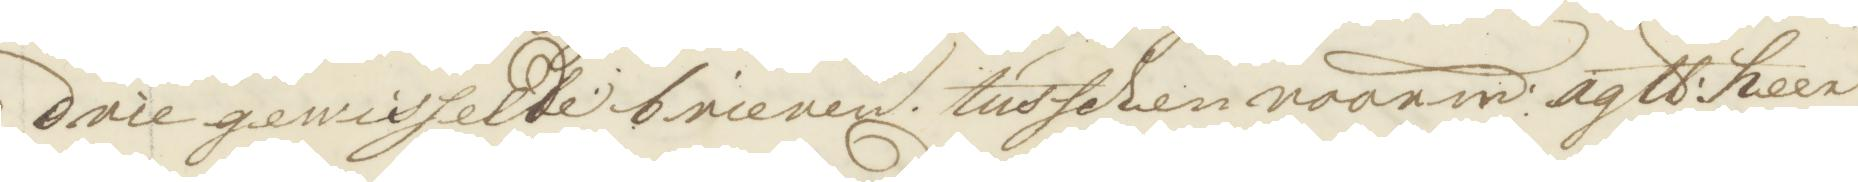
drie gewisselde brieven tusschen voorm: agtb: heer
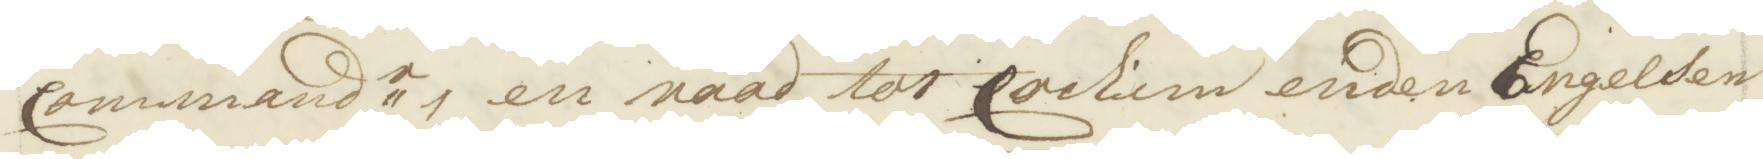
Command„r, en raad tot Cochim enden Engelsen
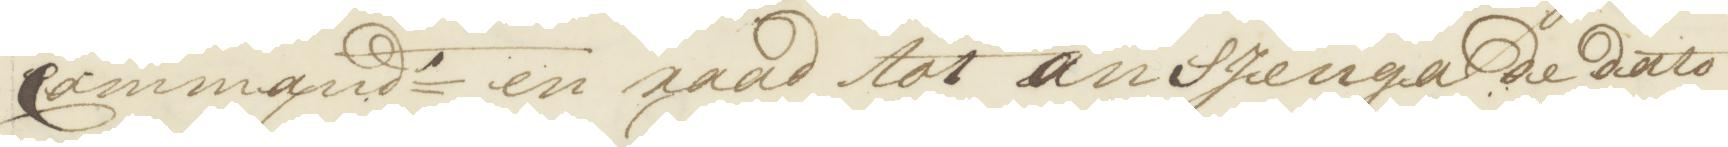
Command=r en raad tot ansjenga de dato
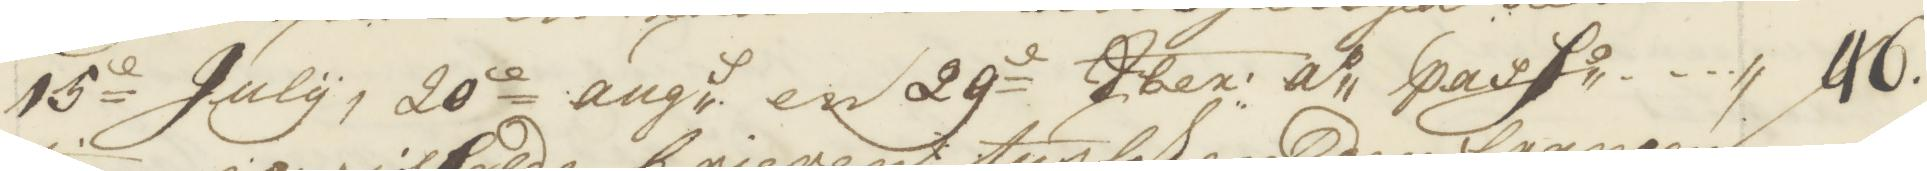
15=e Julij, 20=e aug„s en 29=e 8ber: a„o pass„o - - - - „ 46.
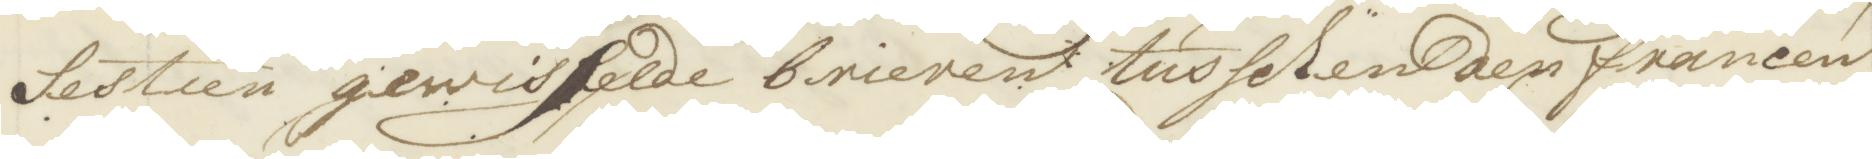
sestien gewisselde brieven tusschen den francen
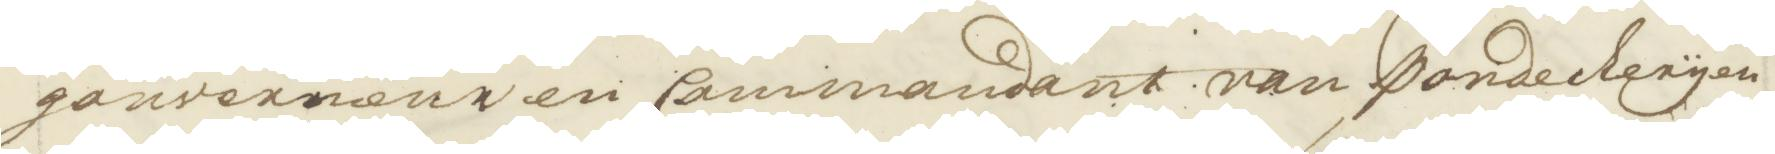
gouverneur en Commandant van pondecherij en
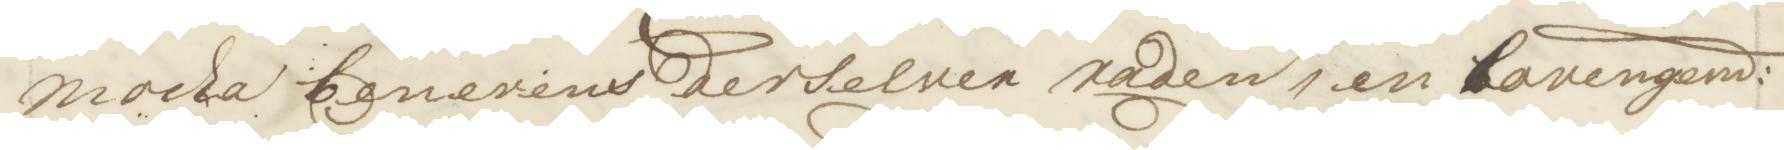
mocha benevens derselver raden„ en bovengem:
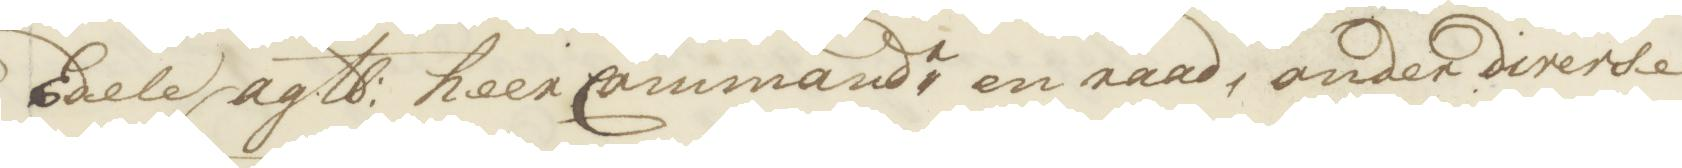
Edele agtb: heer Command„r en raad, onder diverse
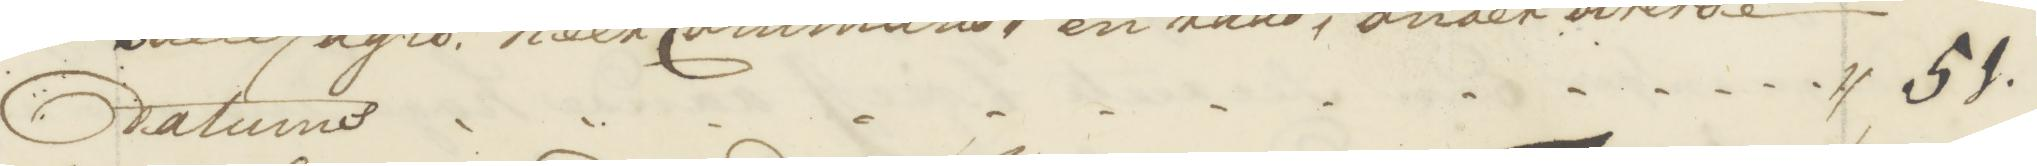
datums - - - - - - - - - - - - - - „ 51.
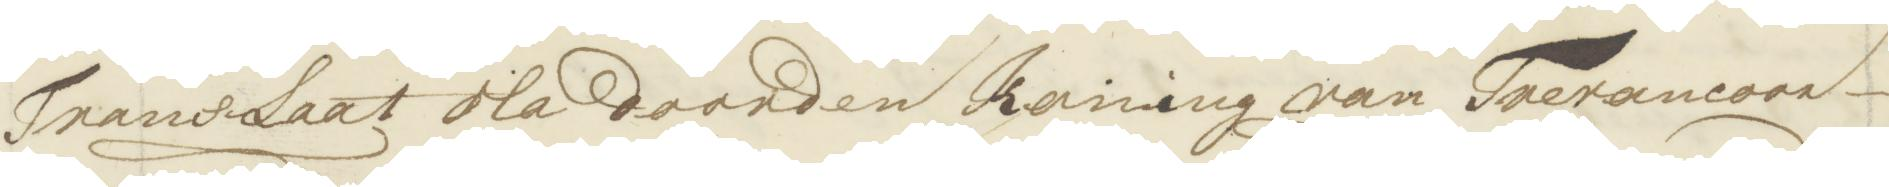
Translaat ola doorden Koning van Trevancoor -
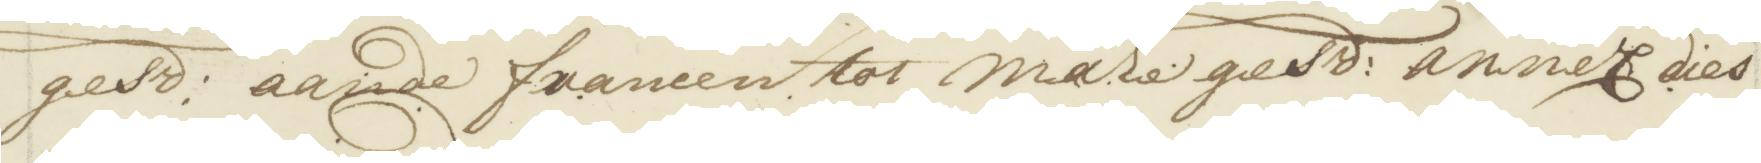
gesr: aan de francen tot mahe gesz: annex dies
